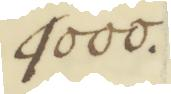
4000.
